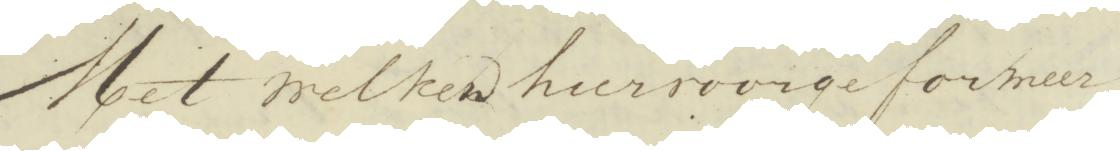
Met welken hiervoorgeformeer,
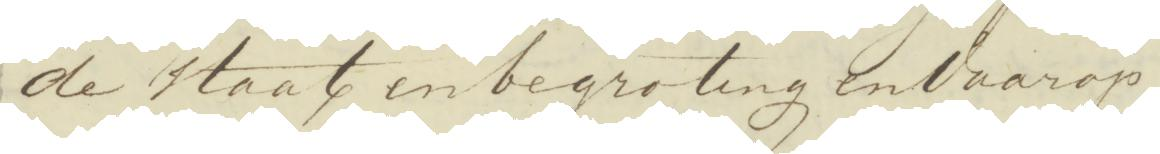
de staat en begroting en daarop
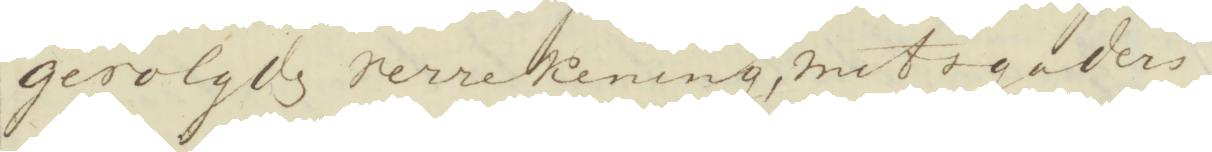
gevolgden verrekening, mitsgaders
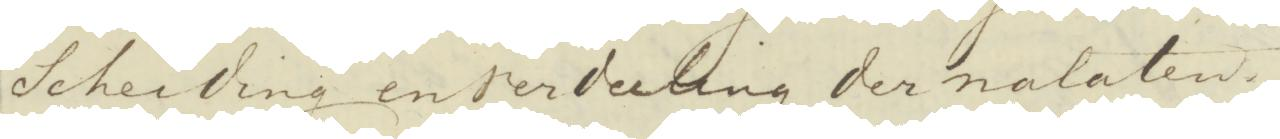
scheiding en verdeeling der nalaten.
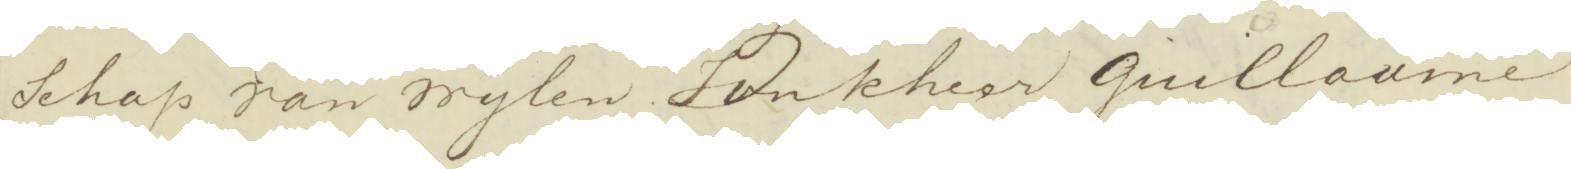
schap van wijlen Ionkheer Guillaume
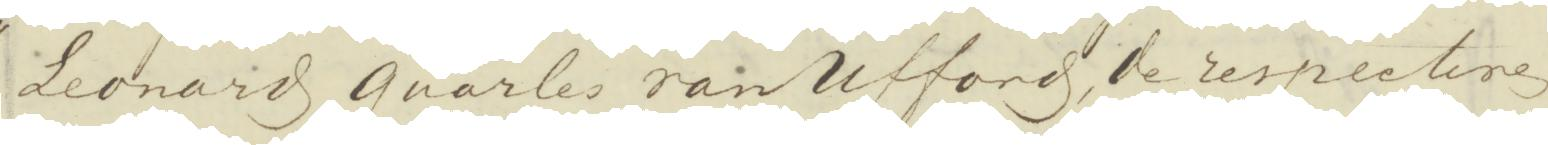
Leonard Quarles vanUfford, de respective
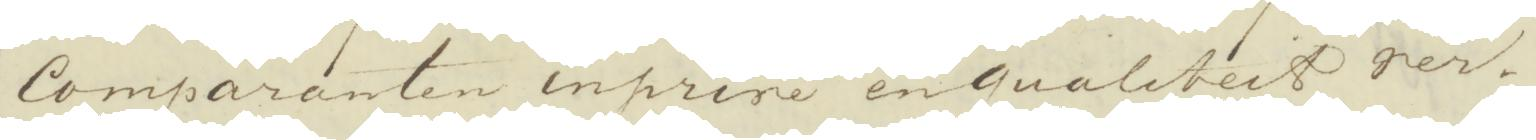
Comparanten inprivé enqualiteit ver„
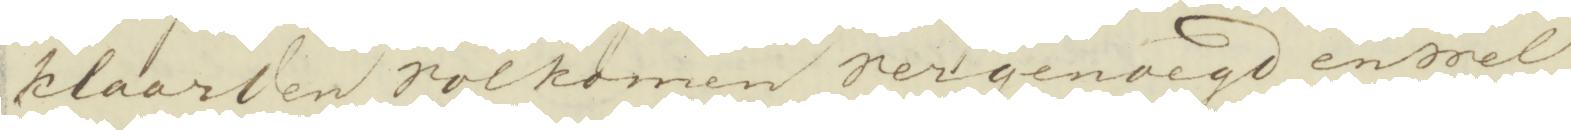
klaarden volkomen vergenoegd enwel
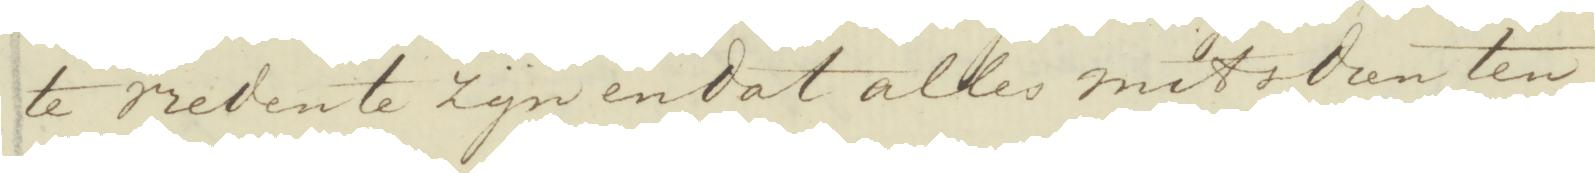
te vreden te zijn endat alles mitsdien ten
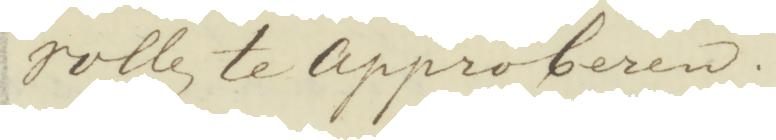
vollen te approberen.
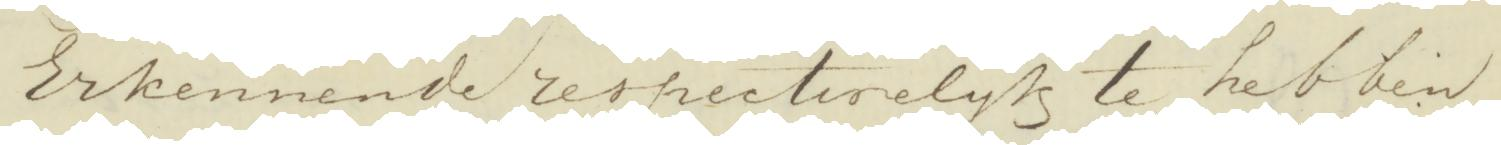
Erkennende respectivelijk te hebben
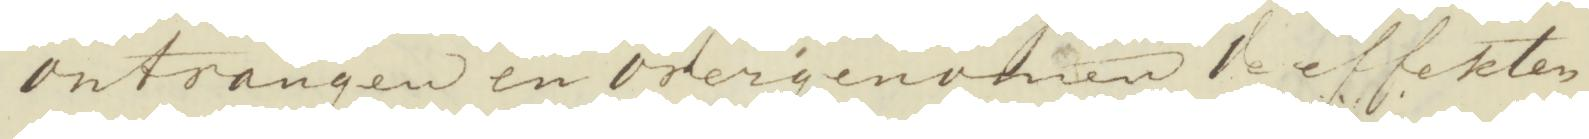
ontvangen en overgenomen de effekten
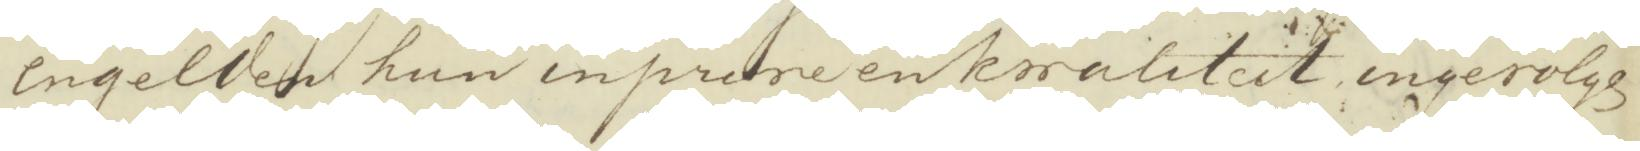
engelden hun inprivé enkwaliteit ingevolge
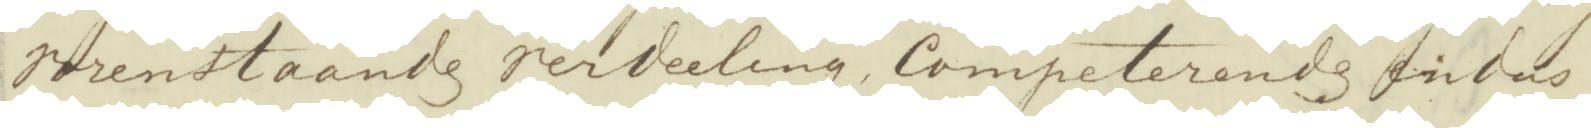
vorenstaande verdeeling, Competerende en dus
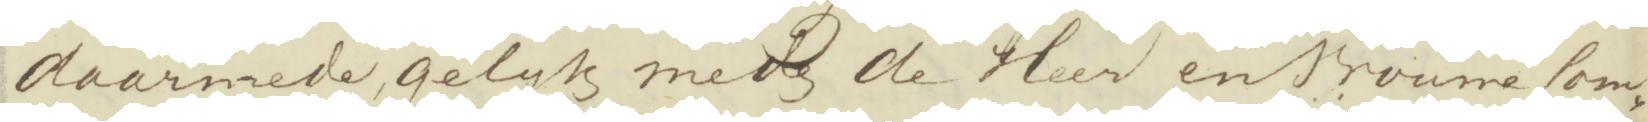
daarmede, gelijk mede de Heer en Vrouwe Com„
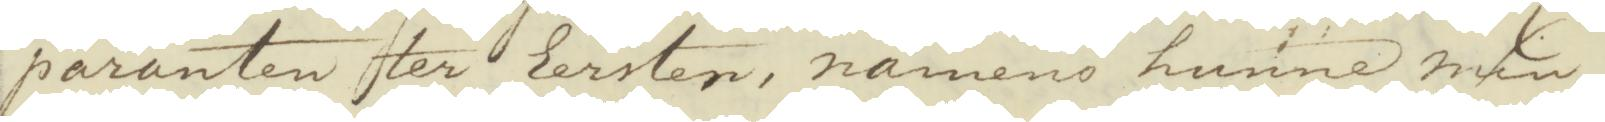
paranten ter Eersten, namens hunne min
